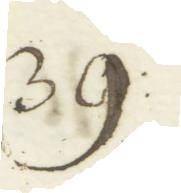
39:
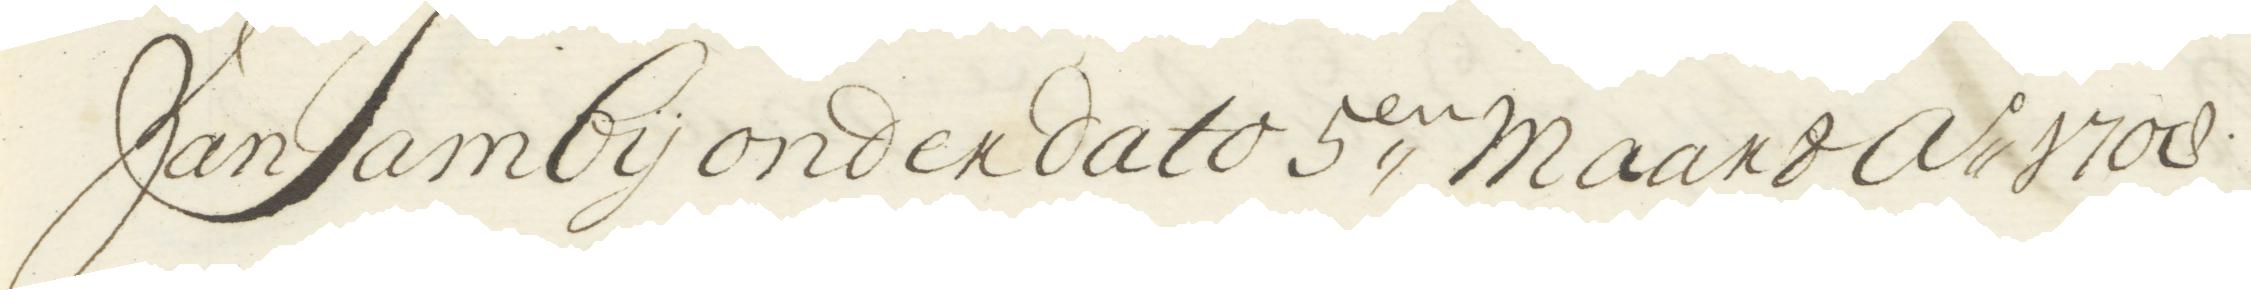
Van Jambij onder dato 5„en Maart A„o 1708
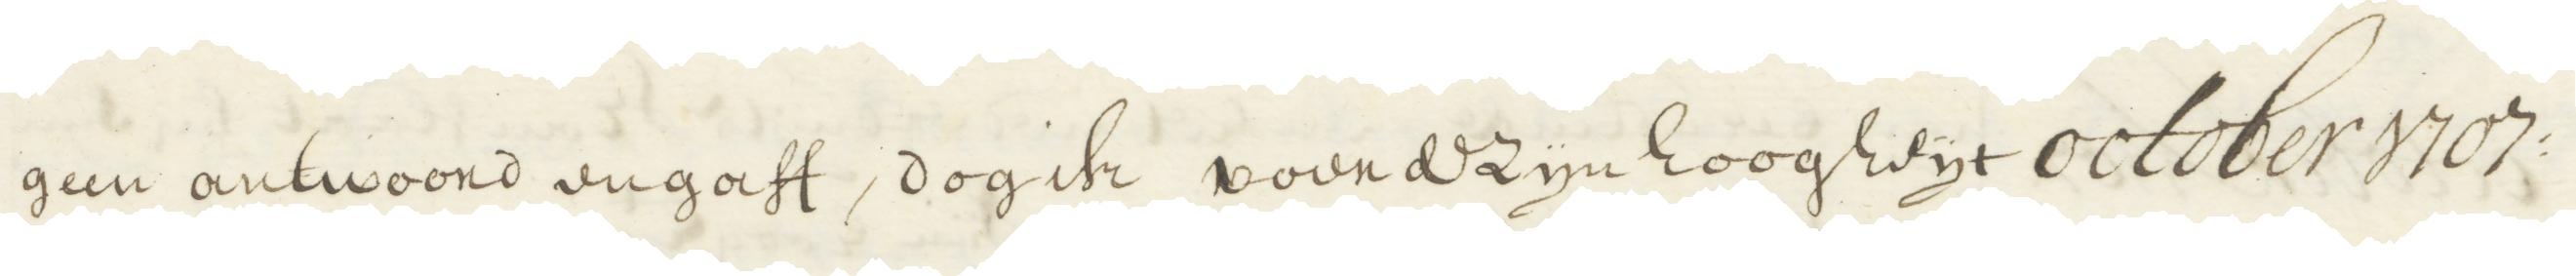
geen antwoord en gaff, dog ik voer de zijn hoogheijt october 1707:
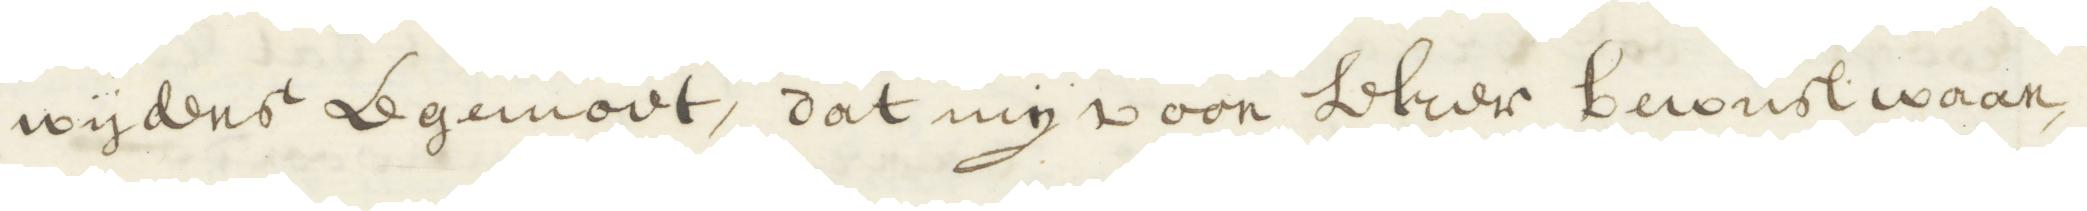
wijders te gemoet, dat mij voor seker bewust waar,
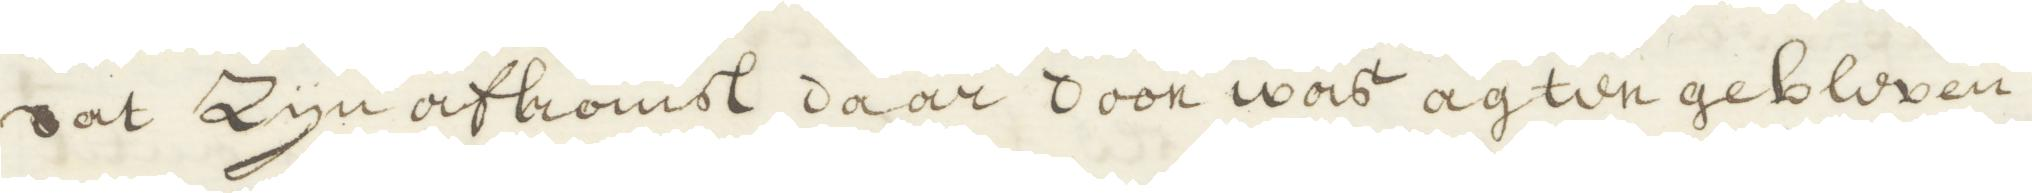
dat zijn afkomst daar door was agter gebleven
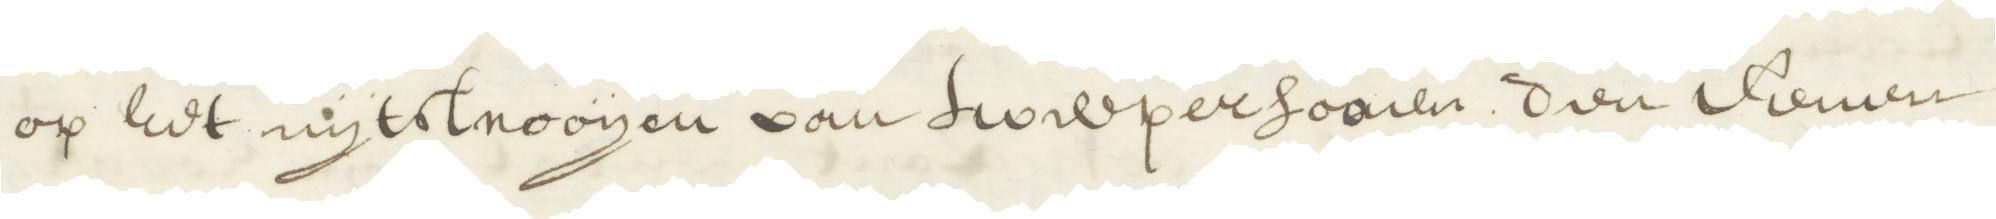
op het uijtstrooijen van tweepersoonen den Eenen
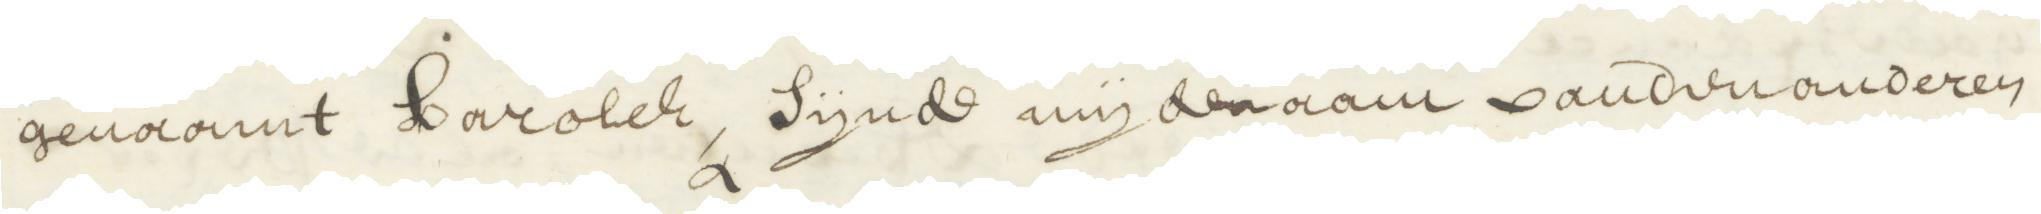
genaamt barolch, sijnde mij denaam vanden anderen
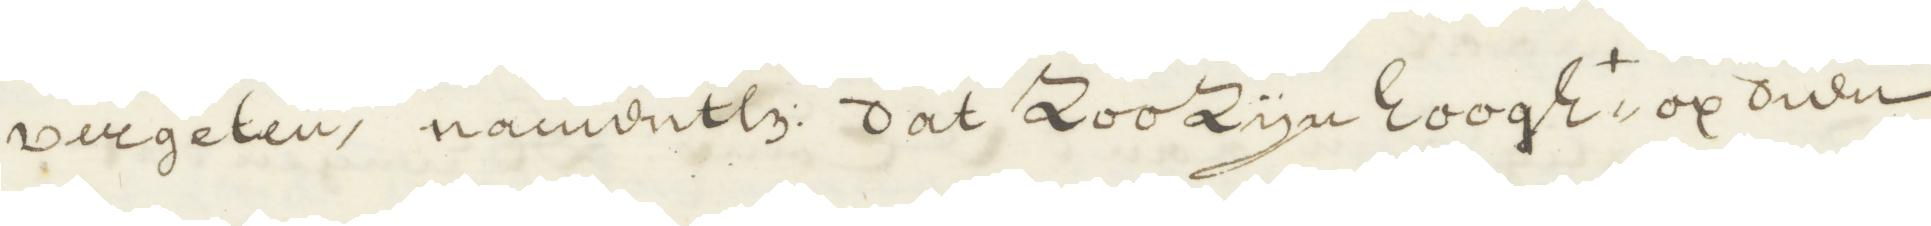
vergeten, namentlijk dat zoo zijn hoogh„t op dien
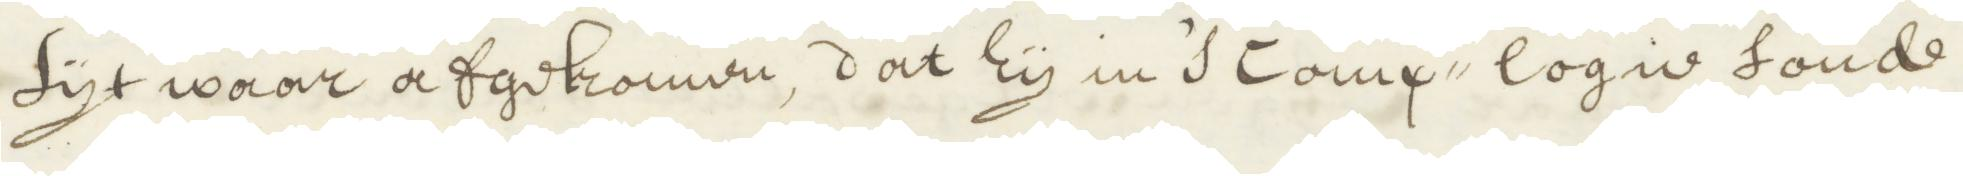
tijt waar afgekomen, dat hij in ’s Comp„s logie soude
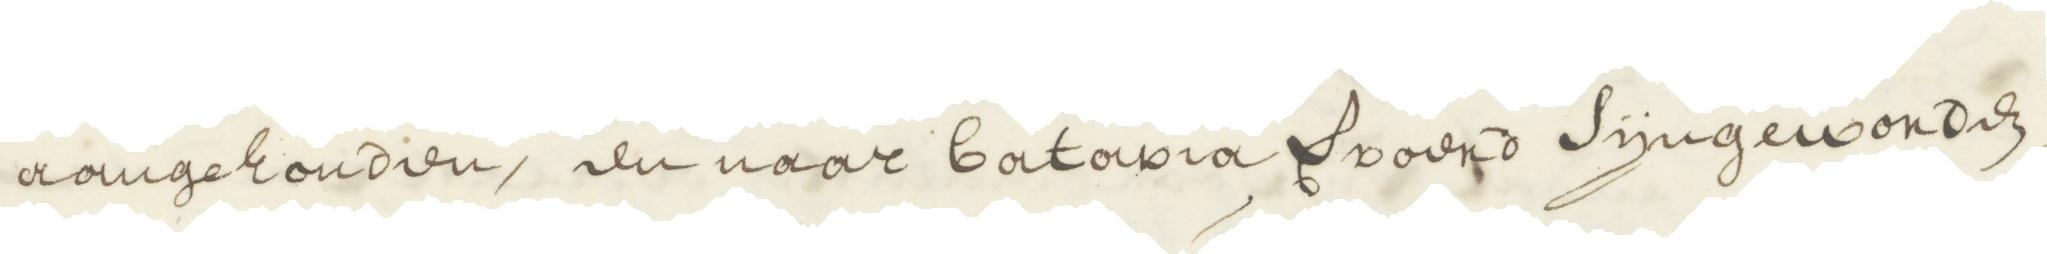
aangehouden, en naar batavia vervoerd sijngeworden,
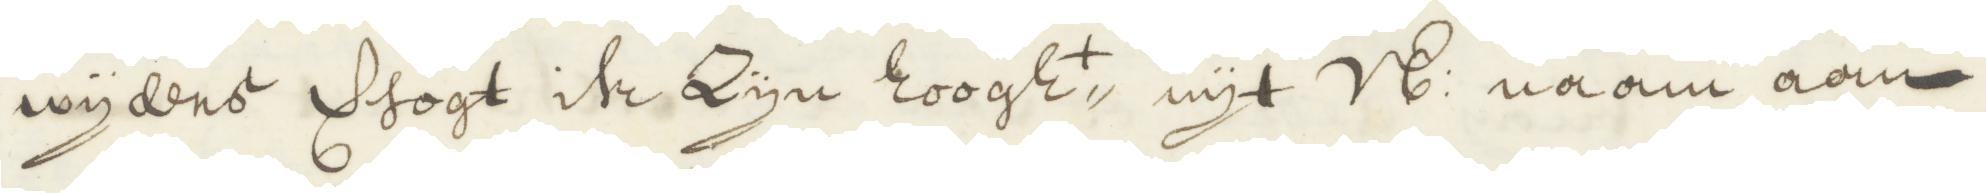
wijders versogt ik zijn hoogh„t uijt VE: naam aan
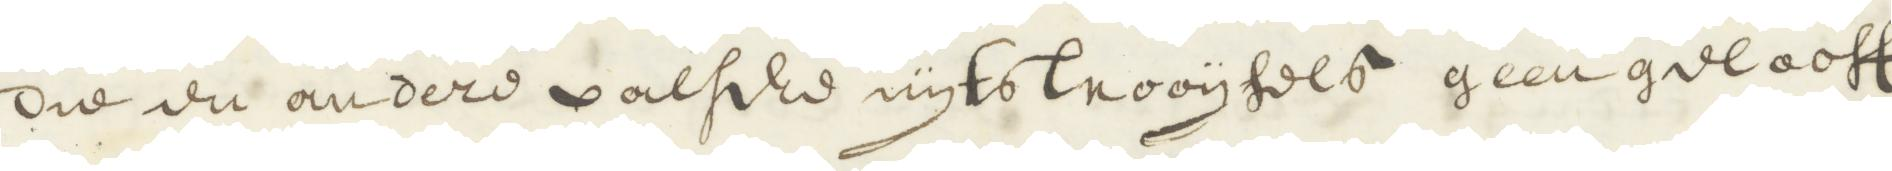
die en andere valsche uijtstrooijsels geen gelooff
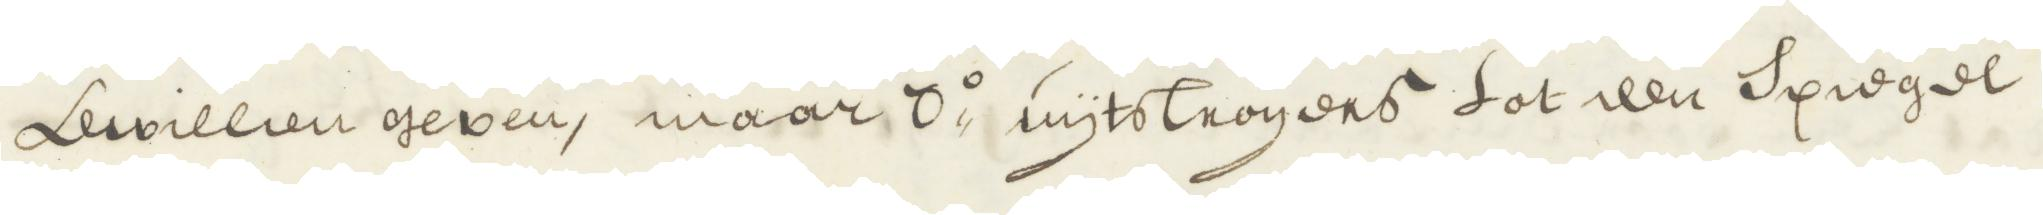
tewillen geven, maar d„o uijtstroyers tot een spiegel
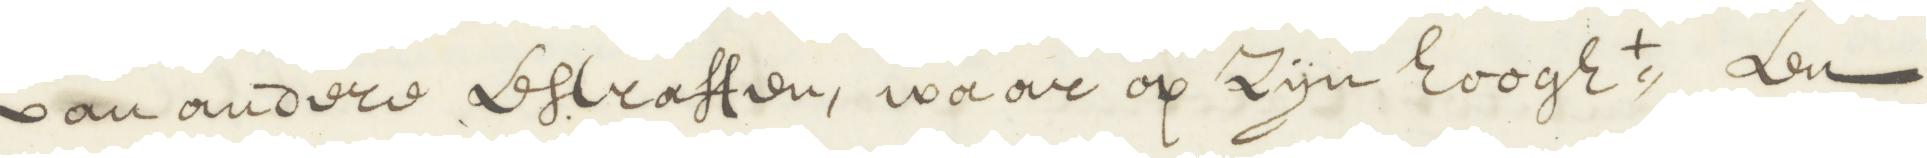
van andere testraffen, waar op zijn hoogh„t ten
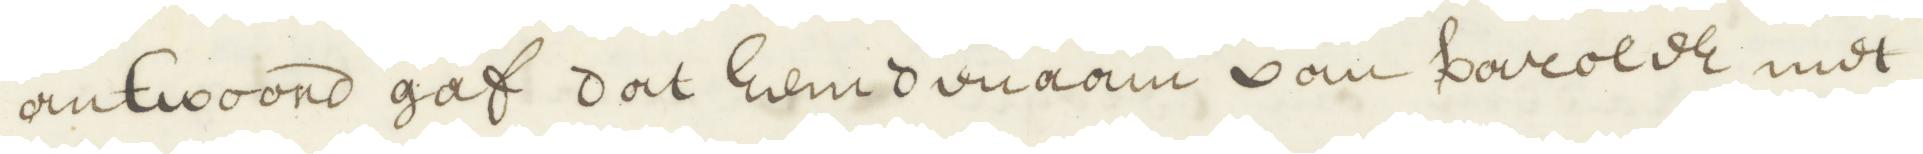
antwoord gaf dat hem denaam van baroleh niet
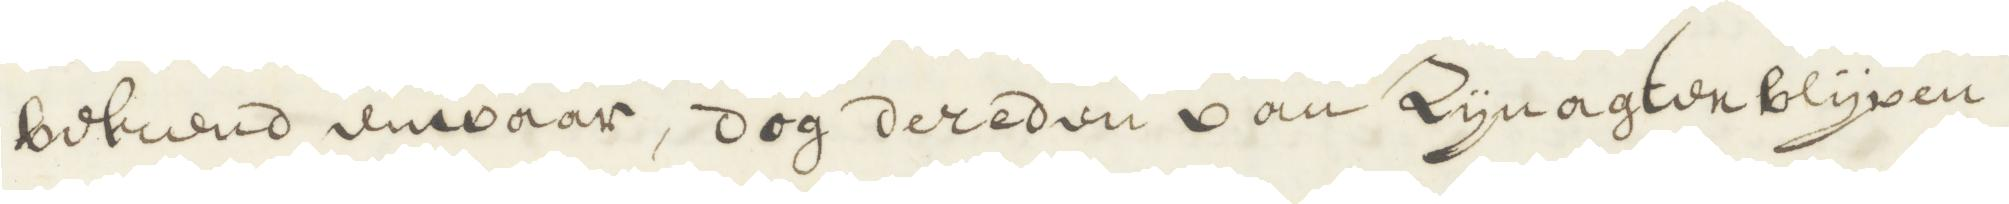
bekend enwaar, dog dereden van zijn agter blijven
